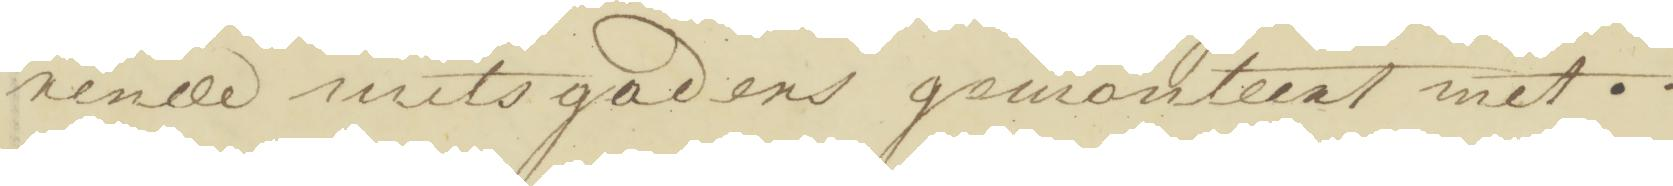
rende mitsgaders gemonteert met.
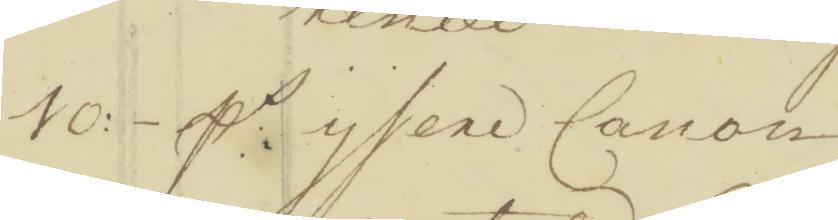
10:- p:s ijsere Canon
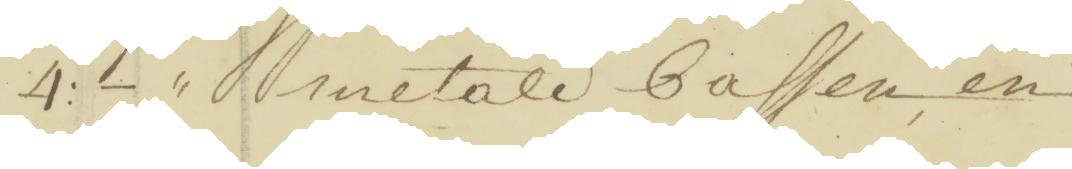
4: - „ metale bassen, en
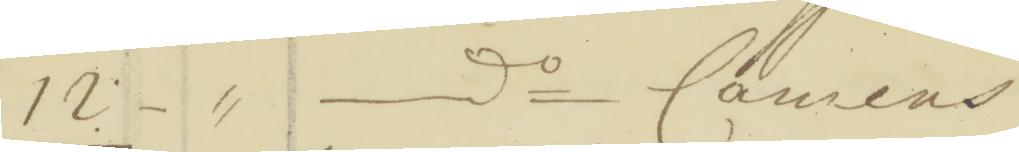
12: - „ D:o Camers
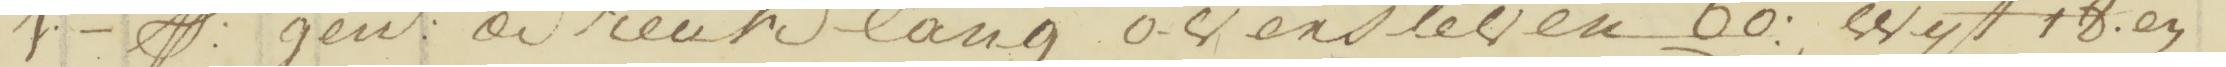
1.- p:s gen:t de reuk lang oversteven 60:, wijt 18. en
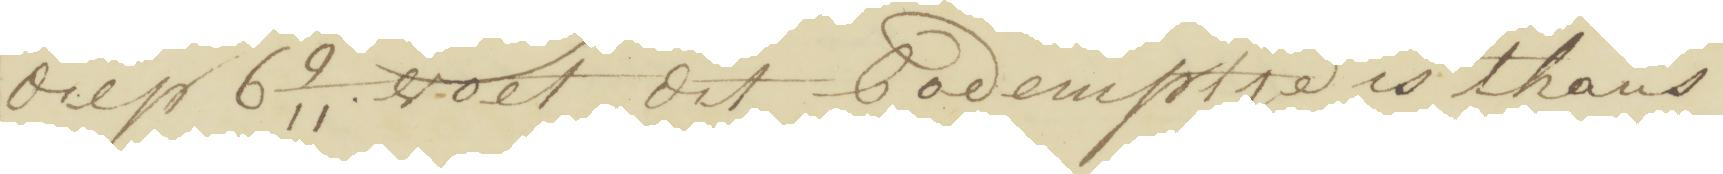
diep 6 9'/11 voet, dit bodemptje is thans
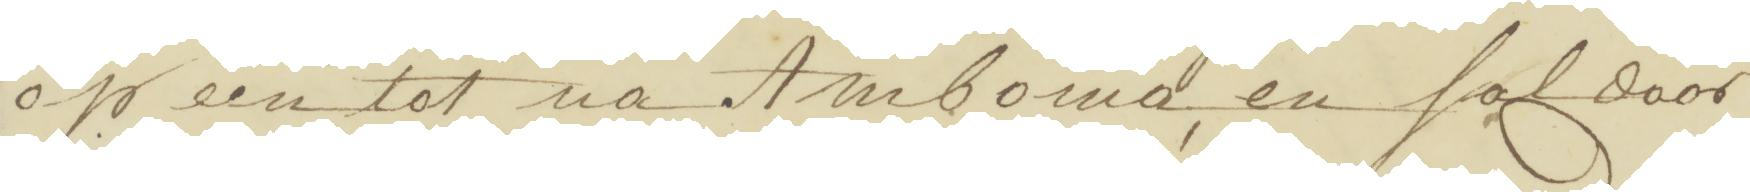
op een tot na Amboina, en Sal door
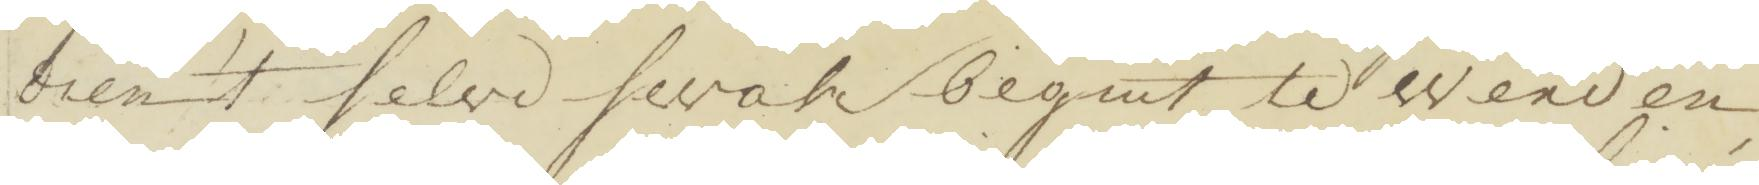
dien 't selve swak begint te werden,
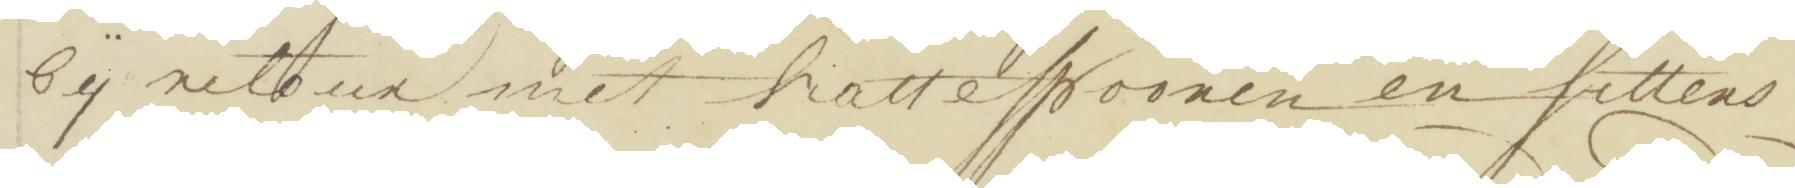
bij retour met kattespooren en fitters
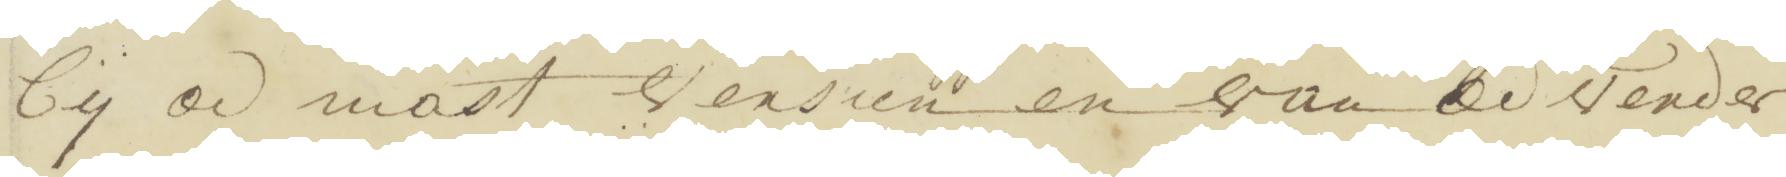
bij de mast versien, en van de verder
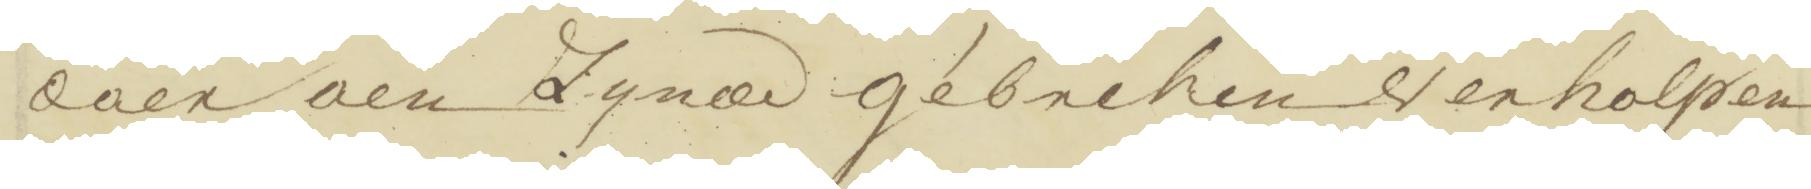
daer aen Zijnde gebreken verholpen
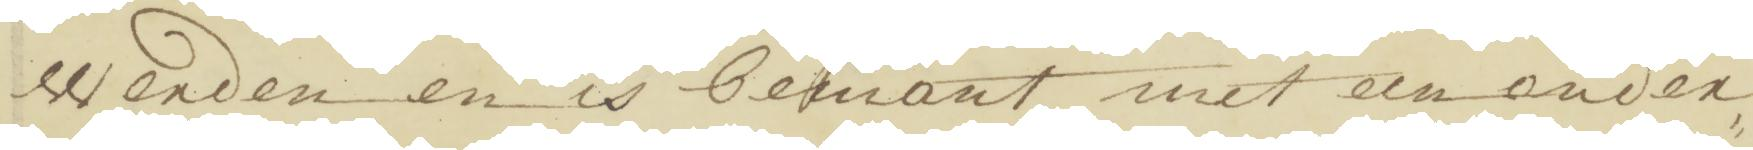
werden, en is bemant met een onder„
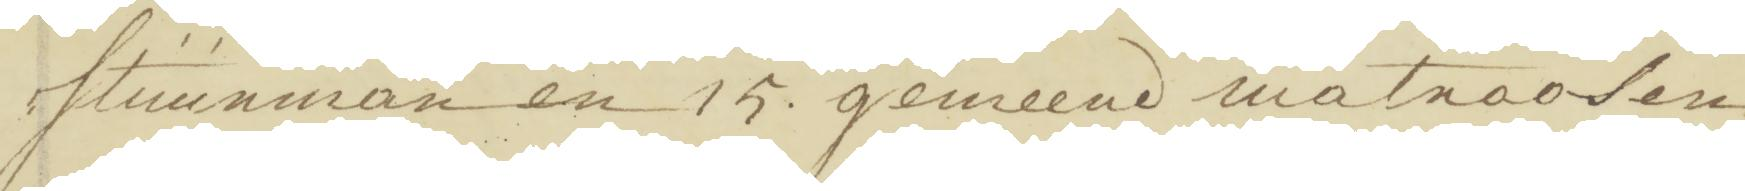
„stuurman en 15. gemeene matroosen,
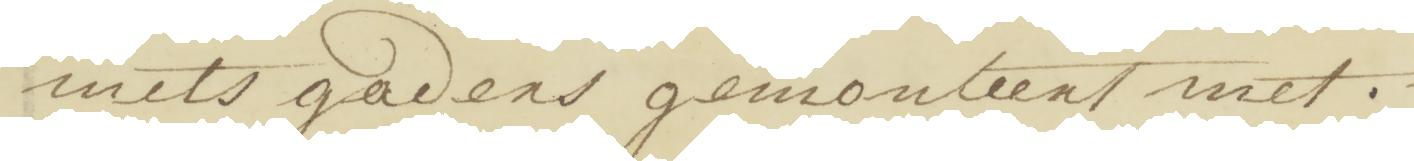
mitsgaders gemonteert met.
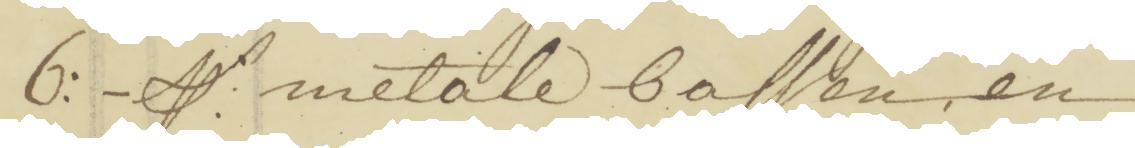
6: – p:s metale bassen, en
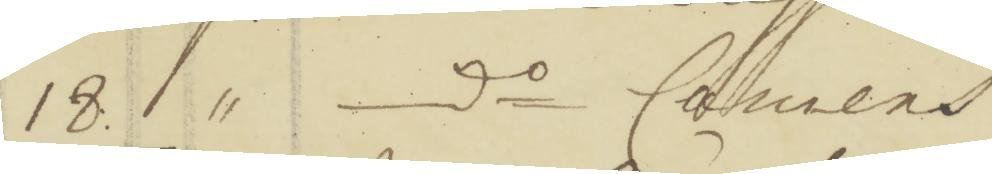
18. „ D:o Camers
